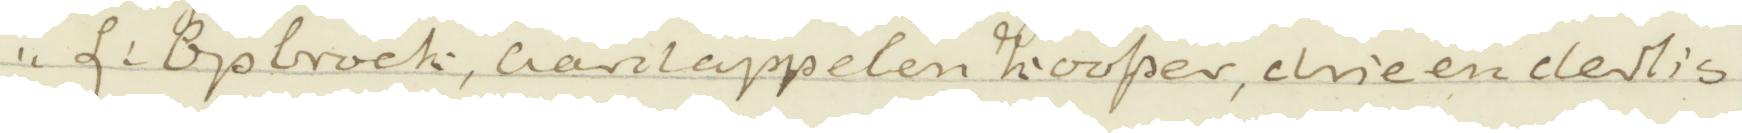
„ L: : Opbroek, aardappelen kooper, drie en dertig
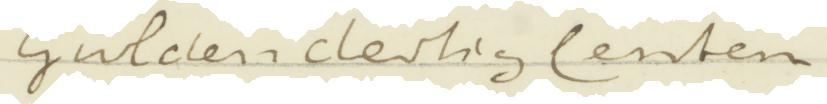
Gulden dertig Centen
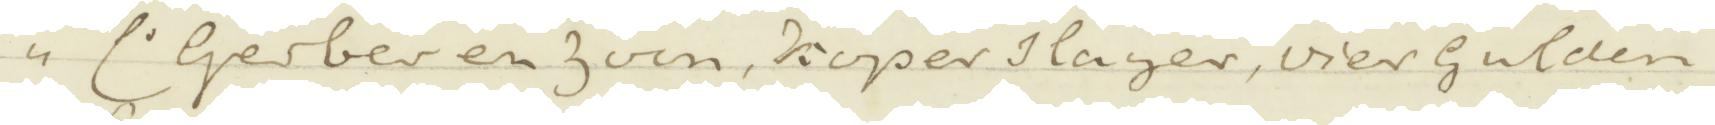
„ C.' Gerber en Zoon, Koperslager, vier Gulden
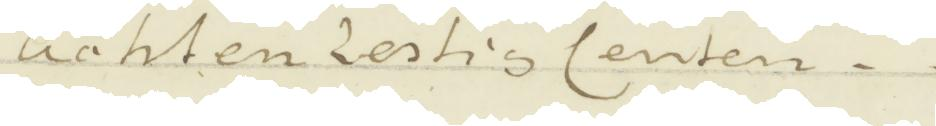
Acht en Zestig Centen -
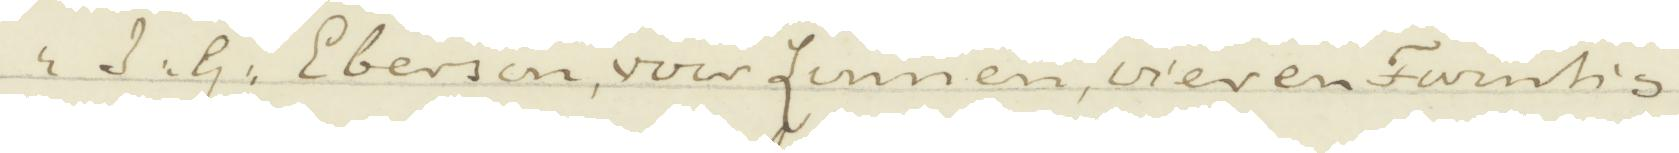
„ I: G: Eberson, voor Linnen, vier en Twintig
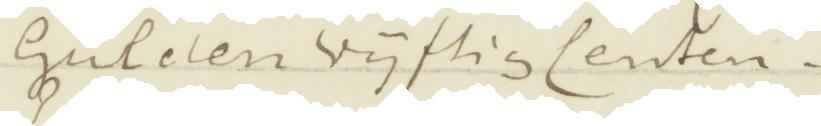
Gulden vijftig Centen
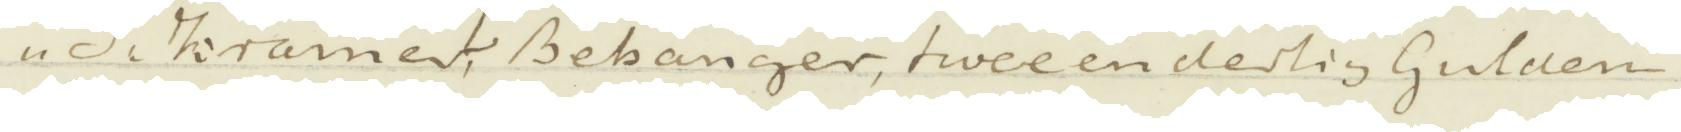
I: Kramer, Behanger, twee en dertig Gulden
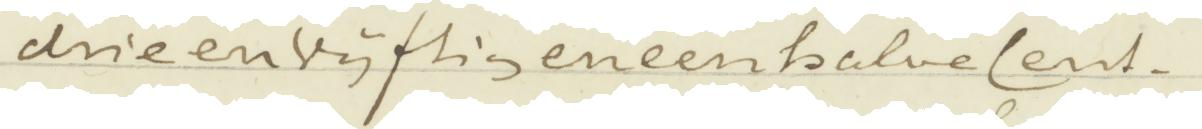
drie en Vijftig en een halve Cent -
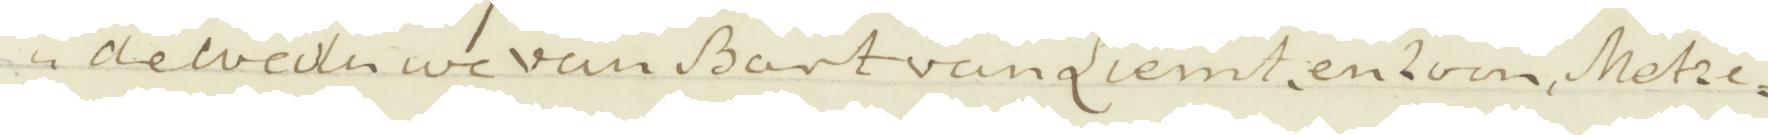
„ de weduwe van Bart van Liemt en Zoon, Metze„
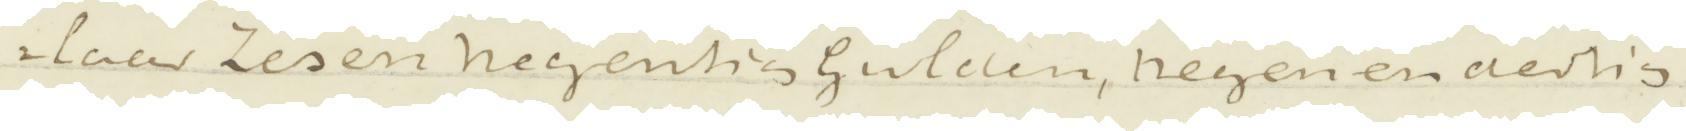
„laar Zes en Negentig Gulden, Negen en dertig
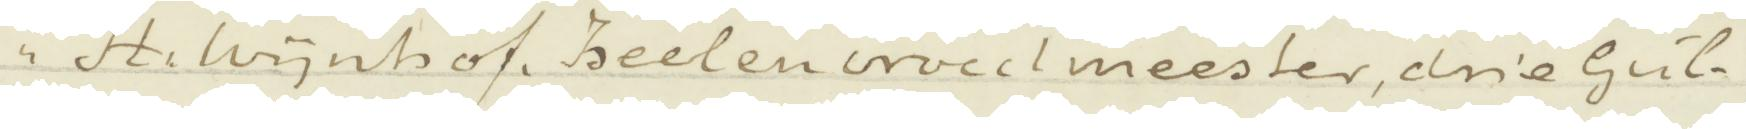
„ H: Wijnhof, Heel en vroedmeester, drie Gul-
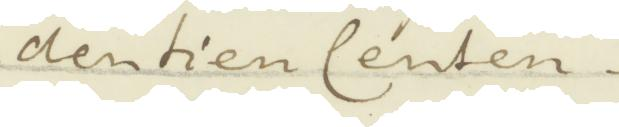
:den tien Centen -
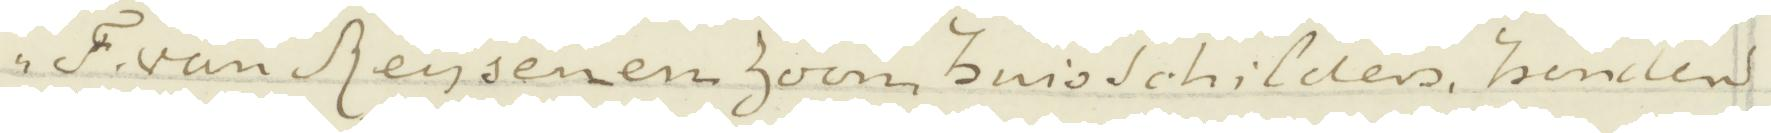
„ F van Reysen en Zoon Huisschilders, Honderd
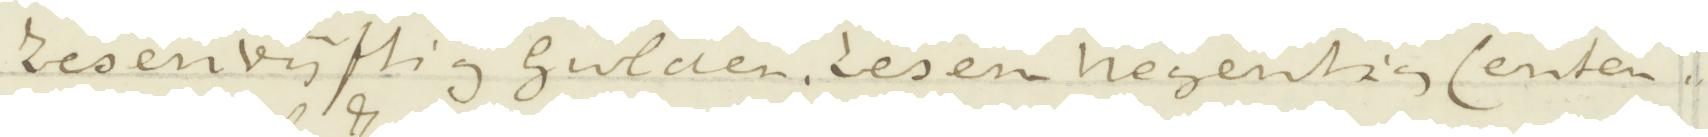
Zes en vijftig Gulden, Zes en Negentig Centen„
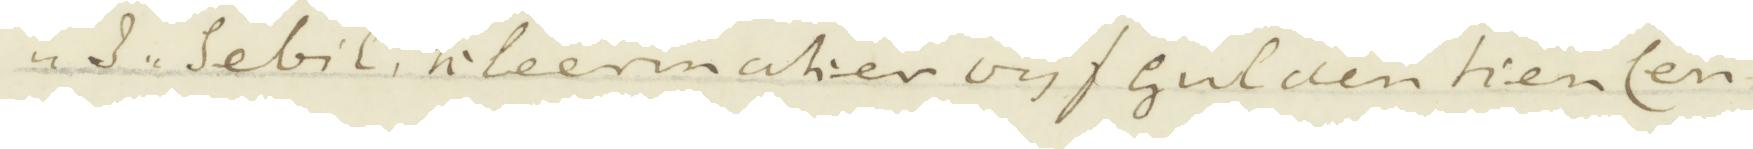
„ I„ Sebil Kleermaker vyf gulden tien Cen
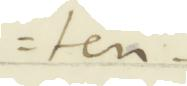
=ten -
